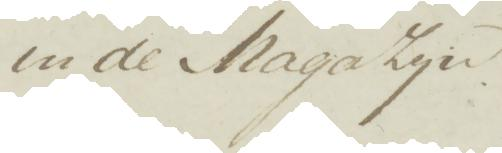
in de Magazijn.
